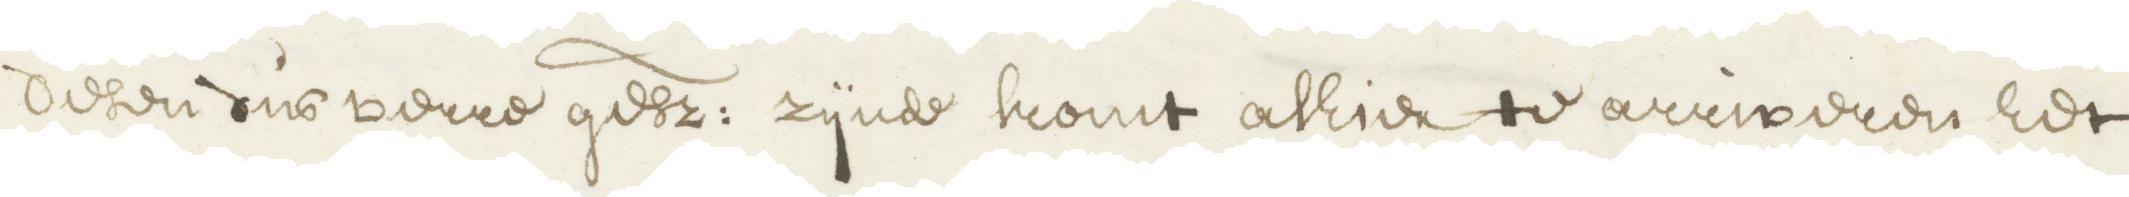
Desen dus verre gesz: zijnde komt alhier te arriveren het
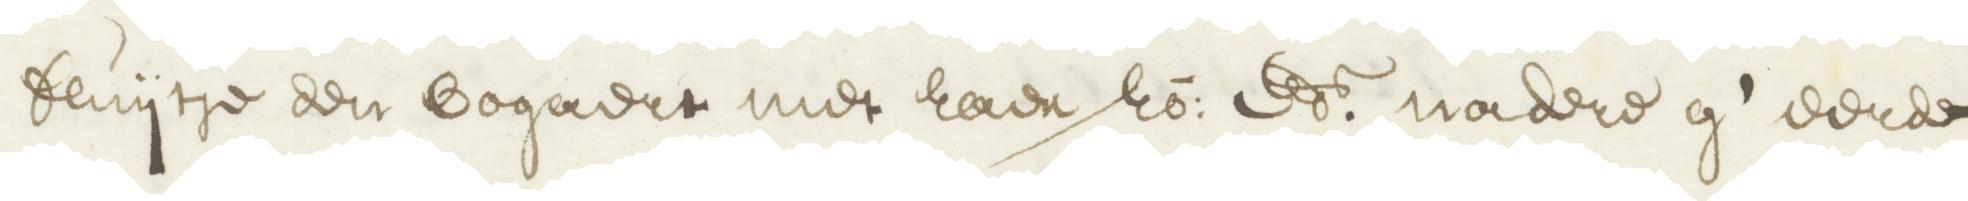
fluijtje den bogaert met haer ho: Ed:s nadere g’eerde
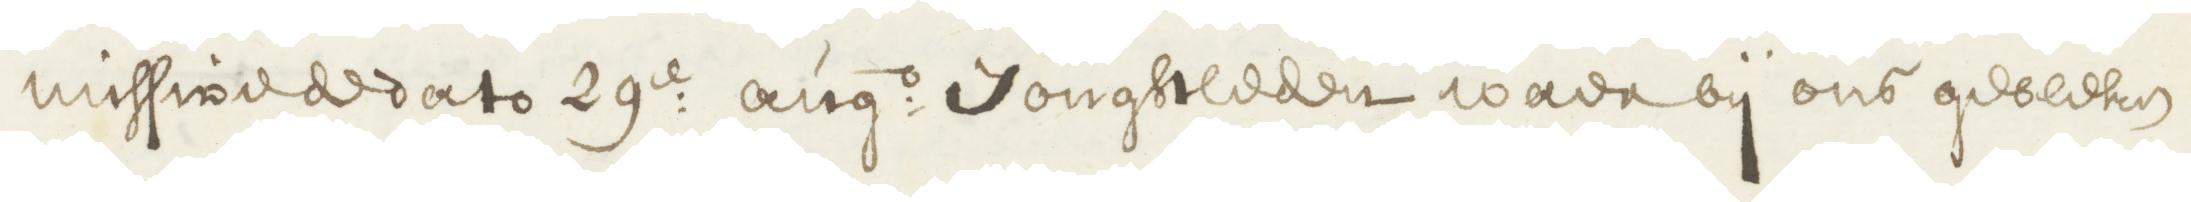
missive de dato 29:e aug:o Iongstleden, waer bij ons gebleken
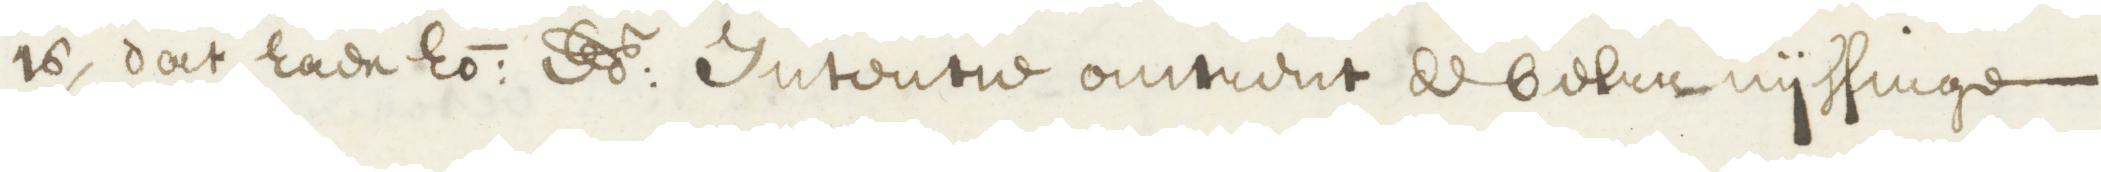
is, dat haer ho: Ed:s Intentie omtrent de bekruijssinge
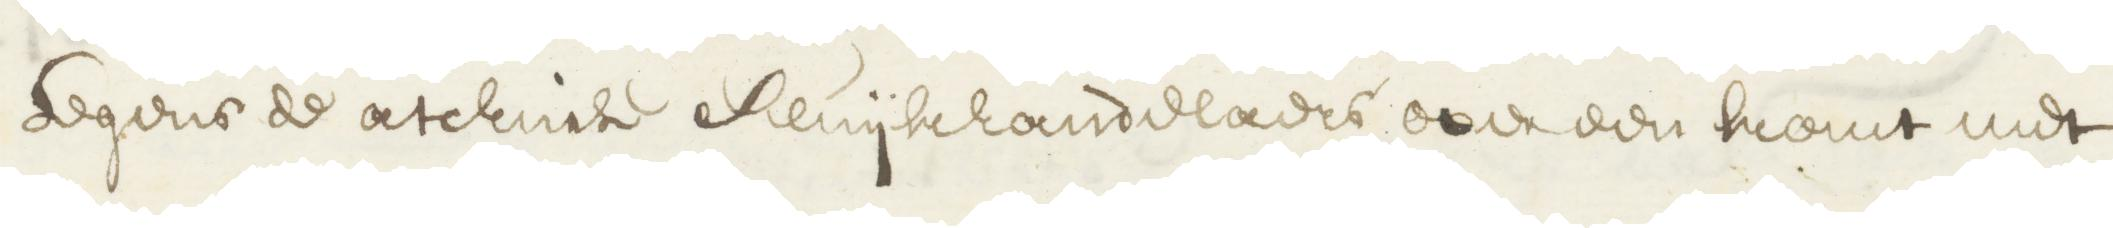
tegens de atchinse Sluijkhandelaers overeen komt met
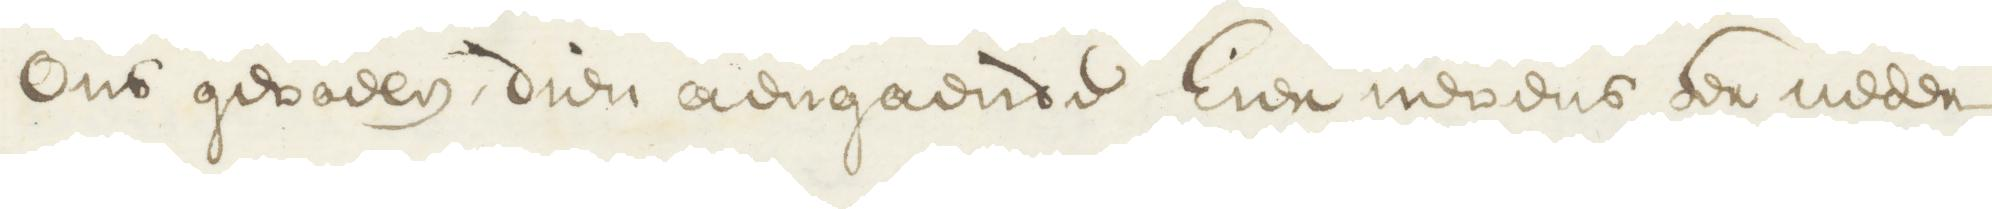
ons gevoelen, dien aengaende hier nevens ter neder
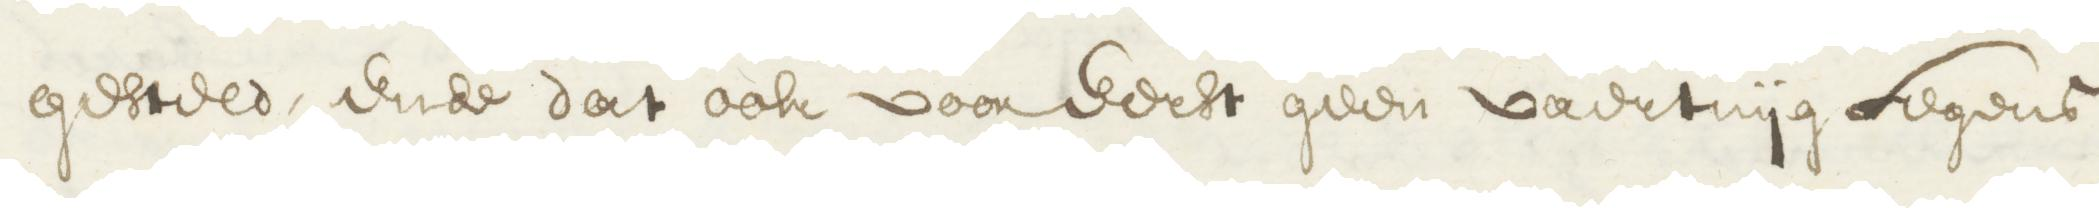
gesteld, ende dat ook voor Eerst geen vaertuijg tegens
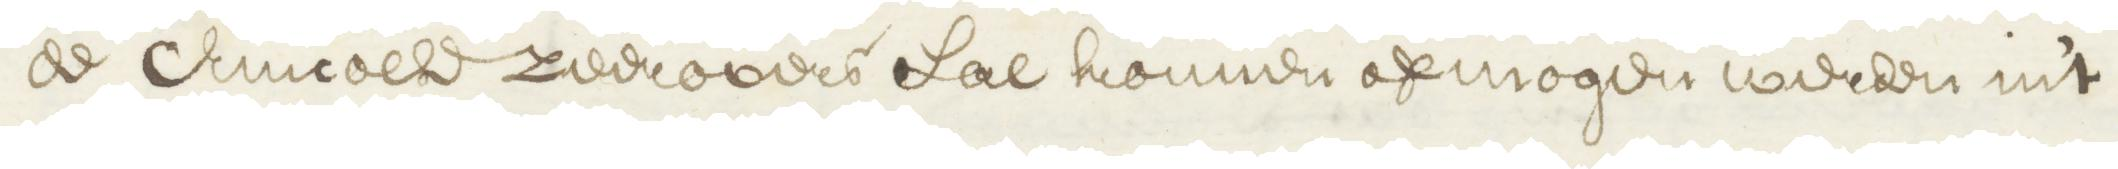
de Chincolle zeerovers sal konnen afmogen werden in ’t
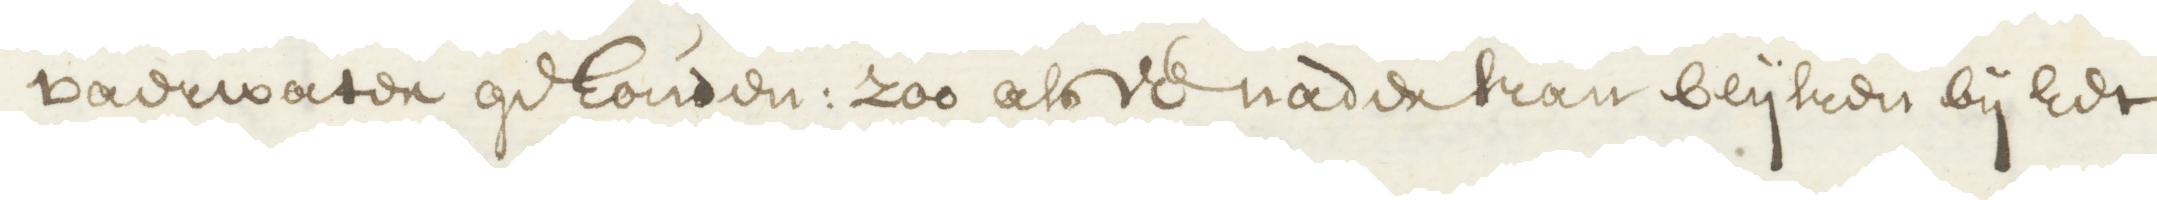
vaerwater gehouden: zoo als ue nader kan blijken bij het
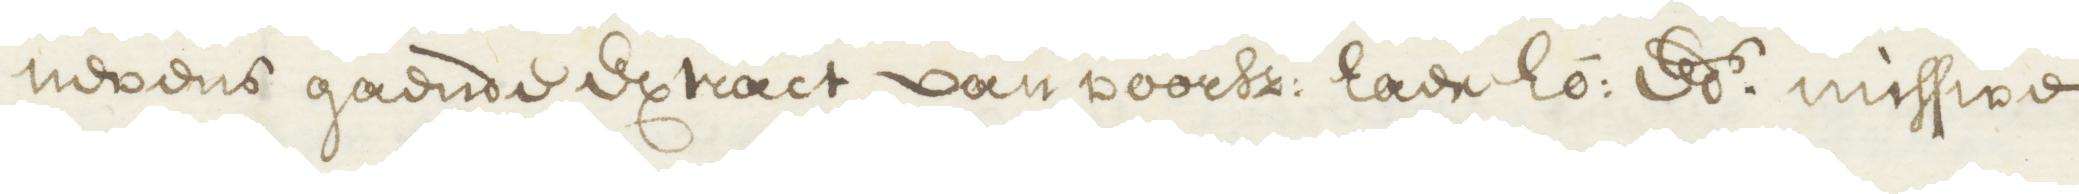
nevens gaende extract van voorsz: haer ho: Ed:s missive
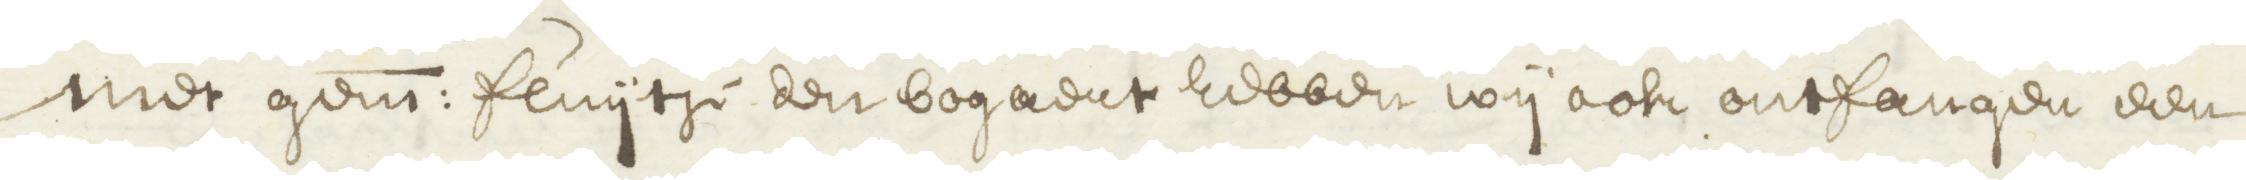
met gem: fluijtje den bogaert hebben wij ook ontfangen een
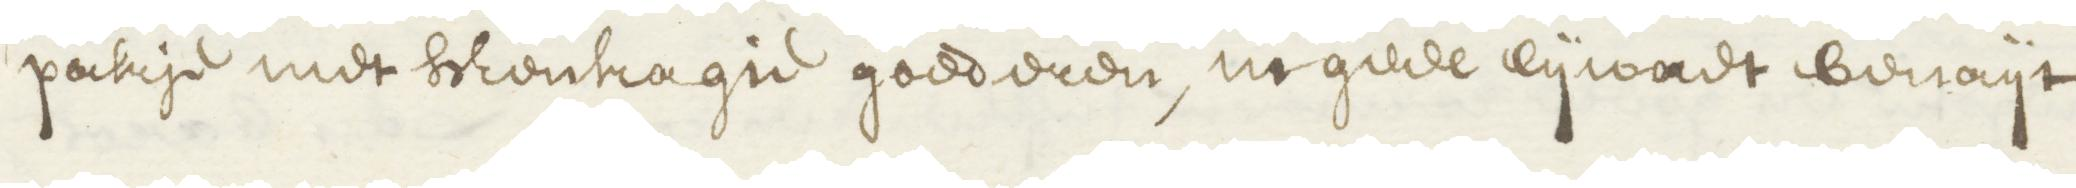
pakje met schenkagie goederen, in geel lijwaet benaijt
